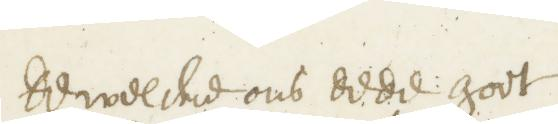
dewelcke ons dede goet
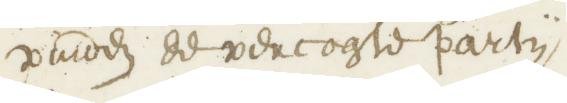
vinden de vercogte partij
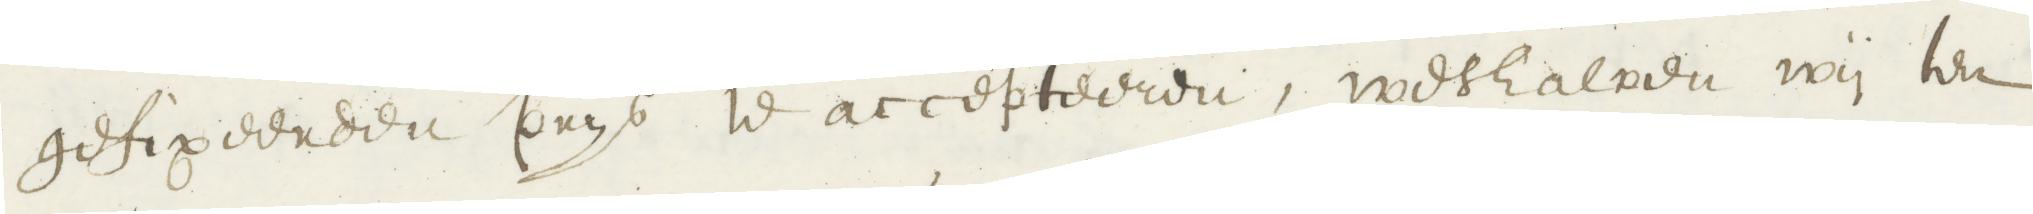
gefixeerden prijs te accepteeren, weshalven wij ten
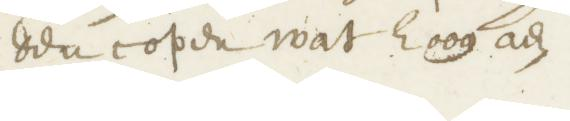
den coper wat hoog aen
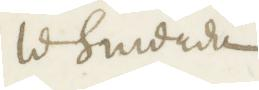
te smeren
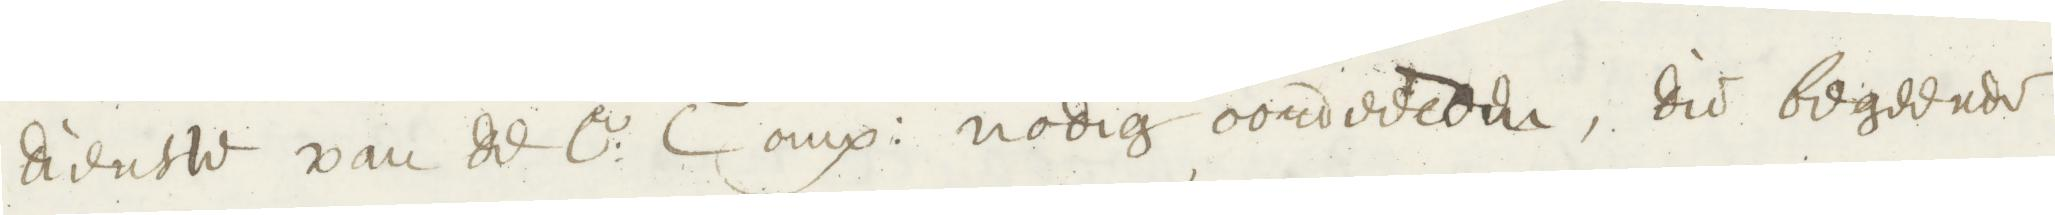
dienste van de E: Comp: nodig oordeelden, die begeerde
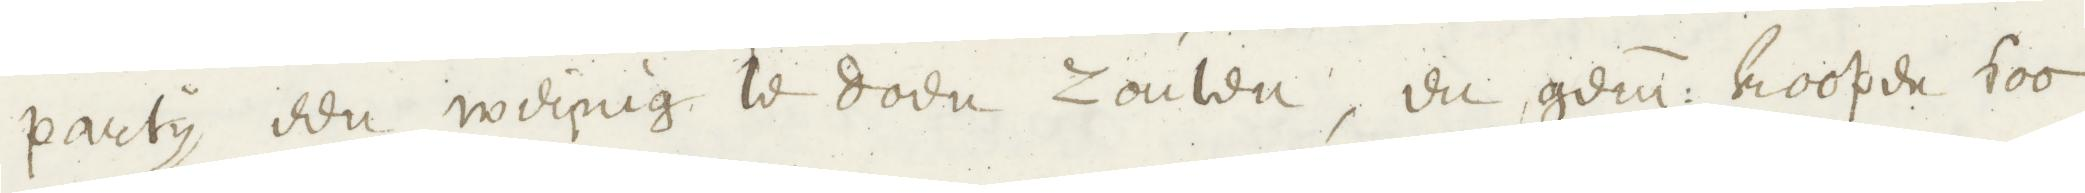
partij een weinig te doen zouten, en gem: kooper soo
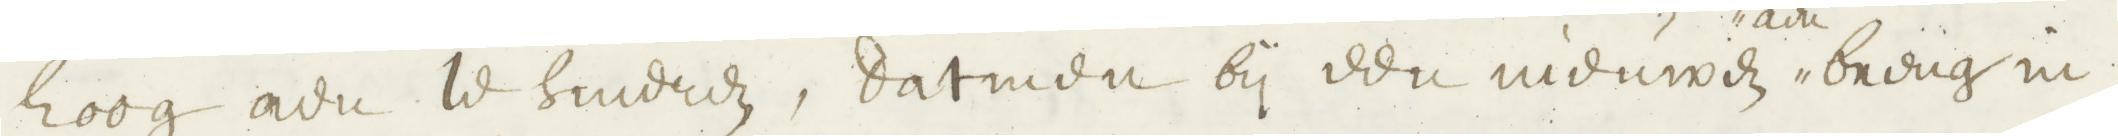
hoog aen te smeren, dat men bij een nieuwen „aen „breng in
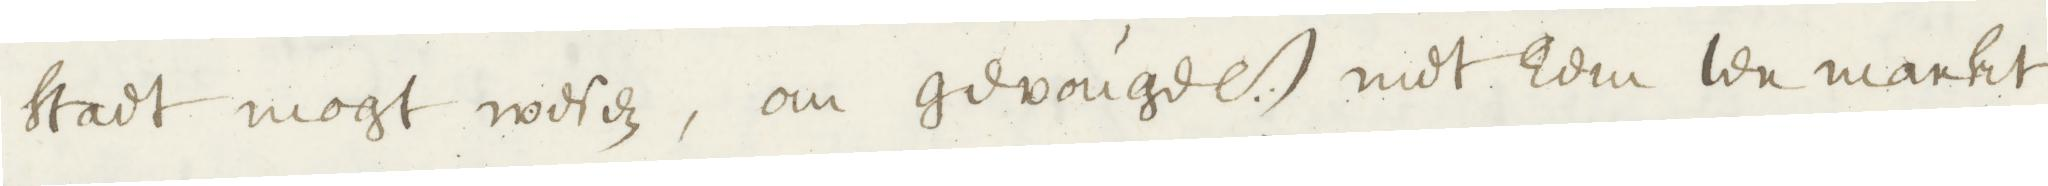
staet mogt wesen, om gevougelijk met hem ter markt
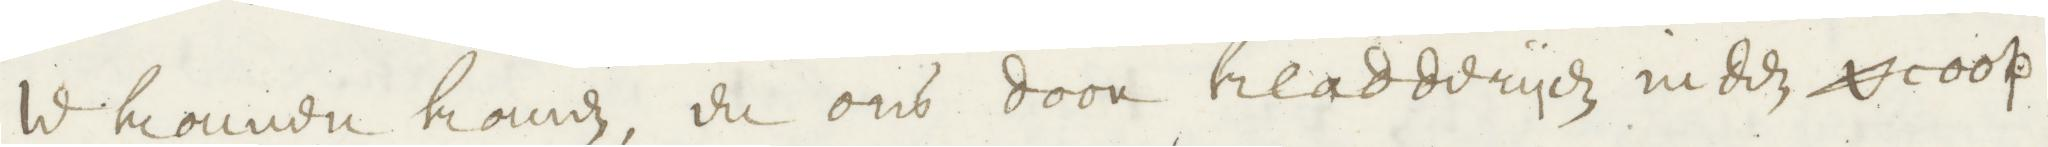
te konnen komen, en ons door kladderijen in den vercoop
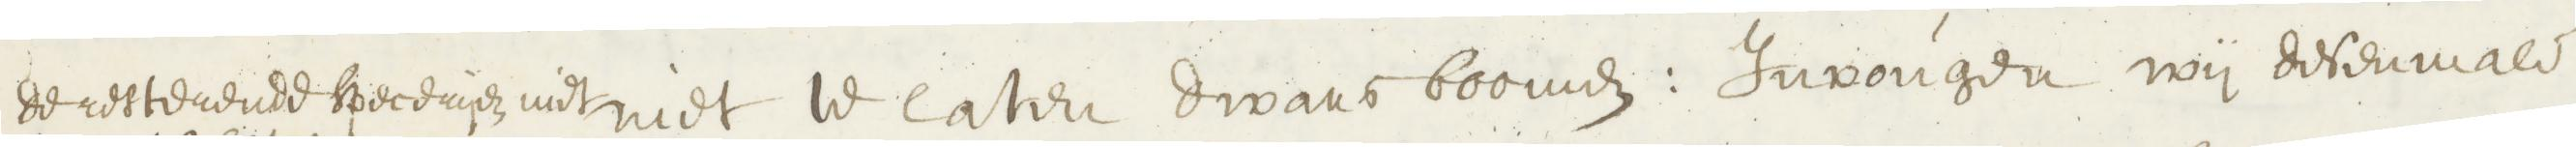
de resterende specerijen niet niet te laten dwarsboomen: Invougen wij desenmale
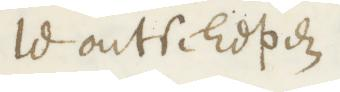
te ontschepen
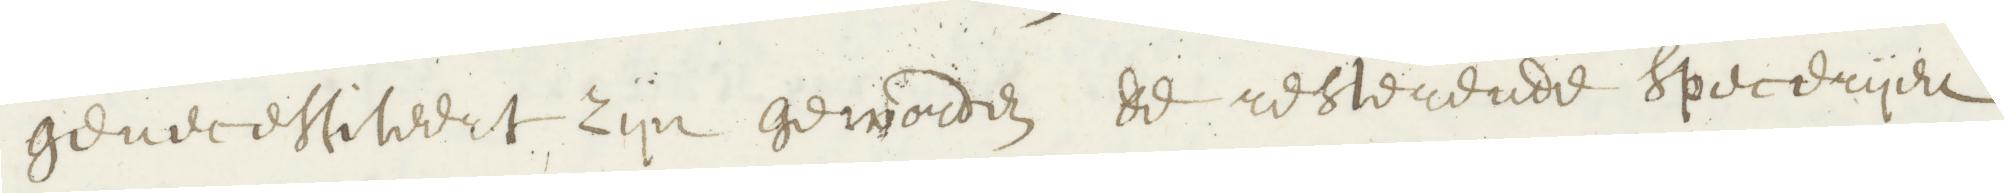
genecessiteert zijn geworden de resterende specerijen
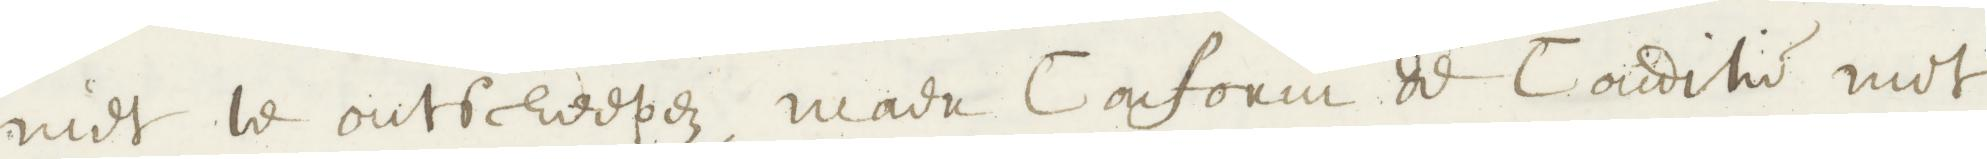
niet te ontscheepen maer Conform: de Conditie met
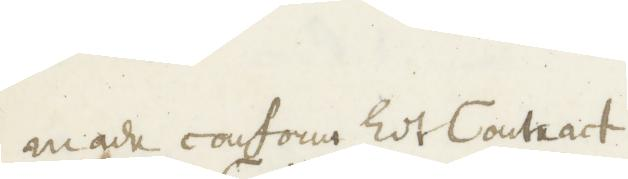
maer conform het Contract
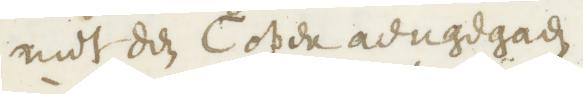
met den Coper aengegaen
